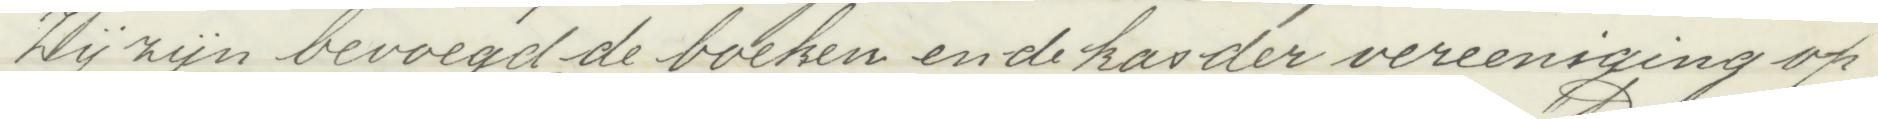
Zij zijn bevoegd de boeken en de kas der vereeniging op
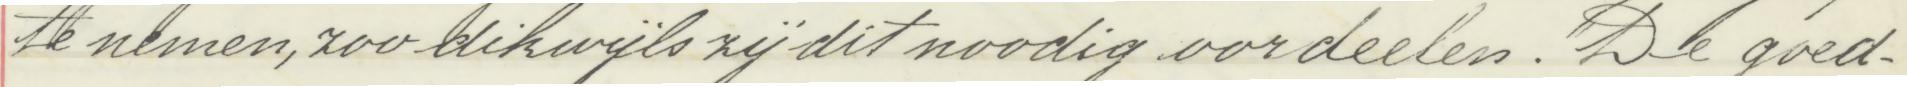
te nemen, zoo dikwijls zij dit noodig oordeelen. De goed-
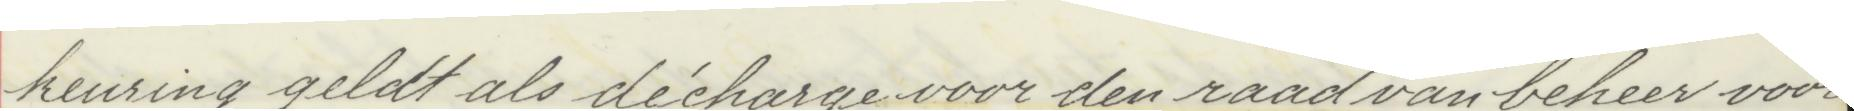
keuring geldt als décharge voor den raad van beheer voor
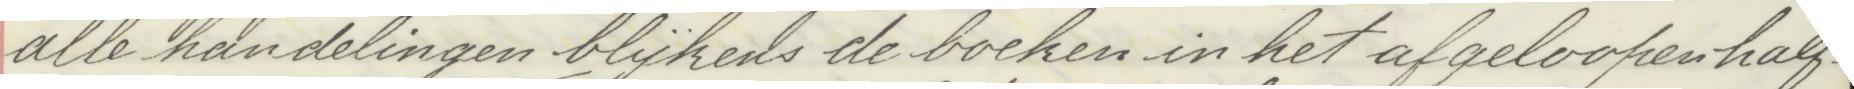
alle handelingen blijkens de boeken in het afgeloopen half
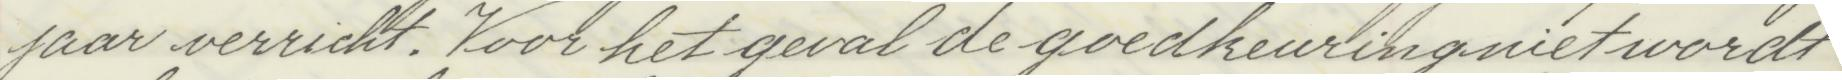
jaar verricht, Voor het geval de goedkeuring niet wordt
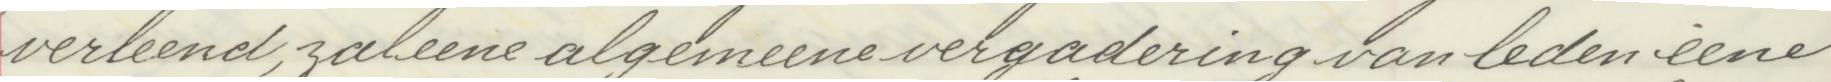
verleend, zal eene algemeene vergadering van leden eene
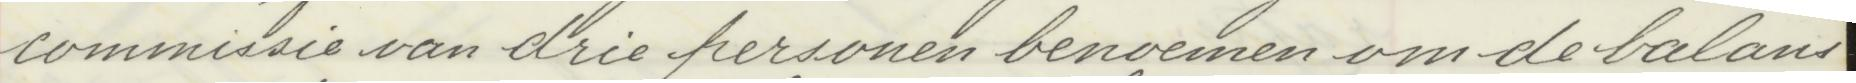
commissie van drie personen benoemen om de balans
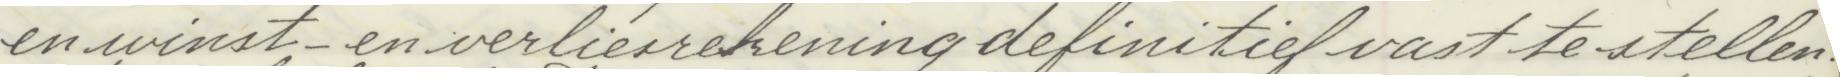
en winst- en verliesrekening definitief vast te stellen.
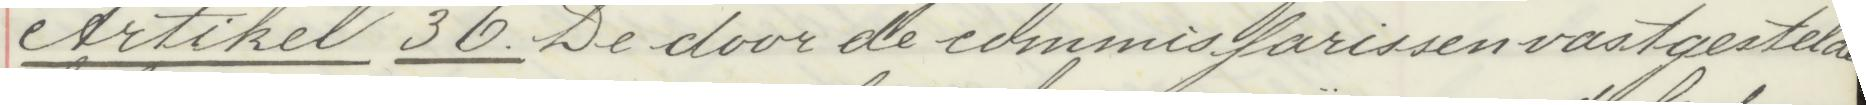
Artikel 36. De door de commissarissen vastgesteld
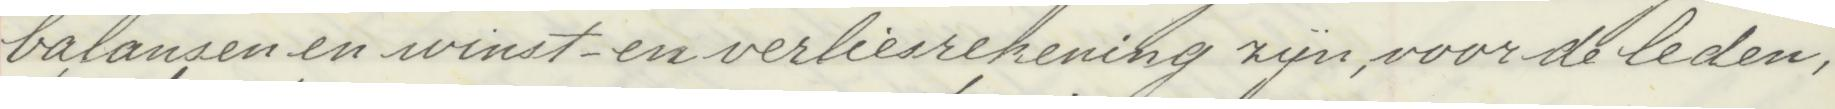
balansen en winst- en verliesrekening zijn, voor de leden,
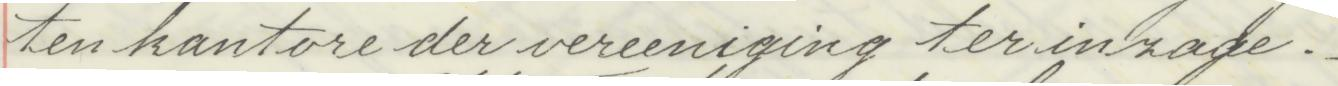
ten kantore der vereeniging ter inzage.
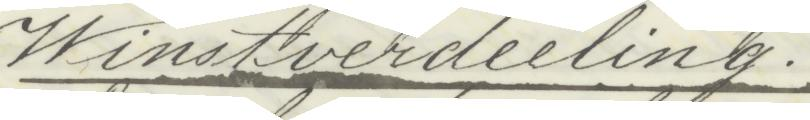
Winstverdeeling.
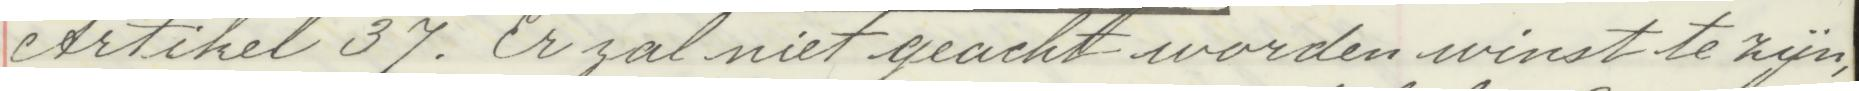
Artikel 37. Er zal niet geacht worden winst te zijn,
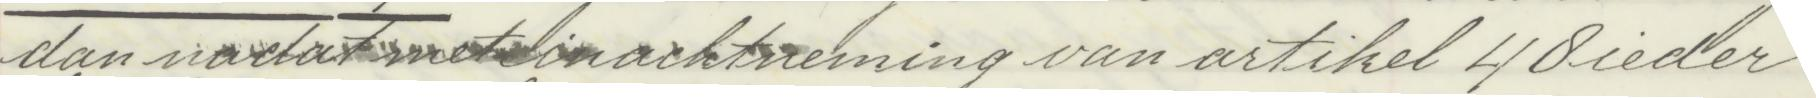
dan nadat met inachtneming van artikel 48 ieder
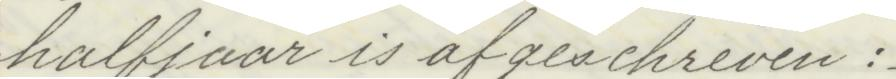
halfjaar is afgeschreven:
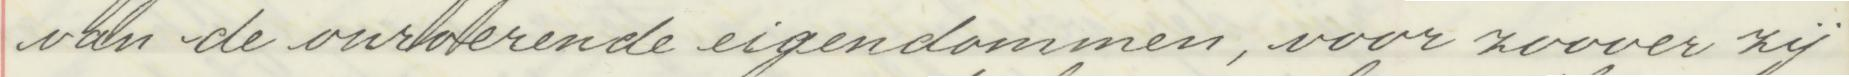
van de onroerende eigendommen, voor zoover zij
